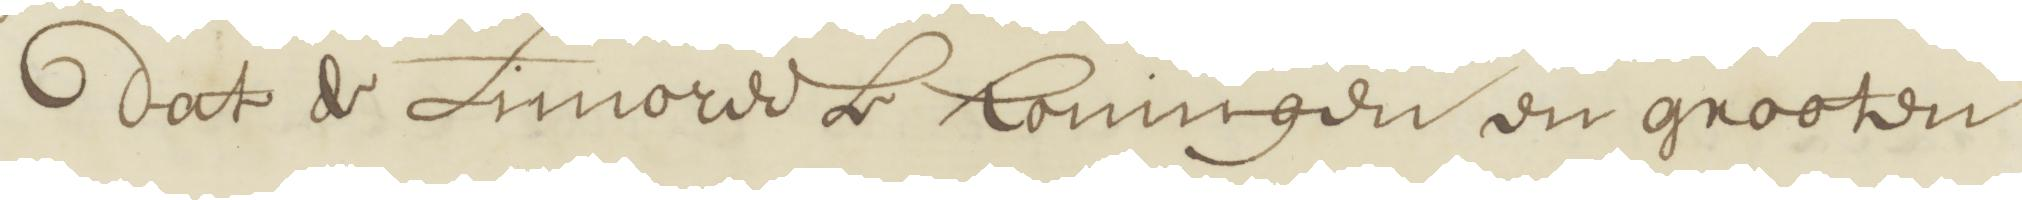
dat de timoreese koningen en grooten
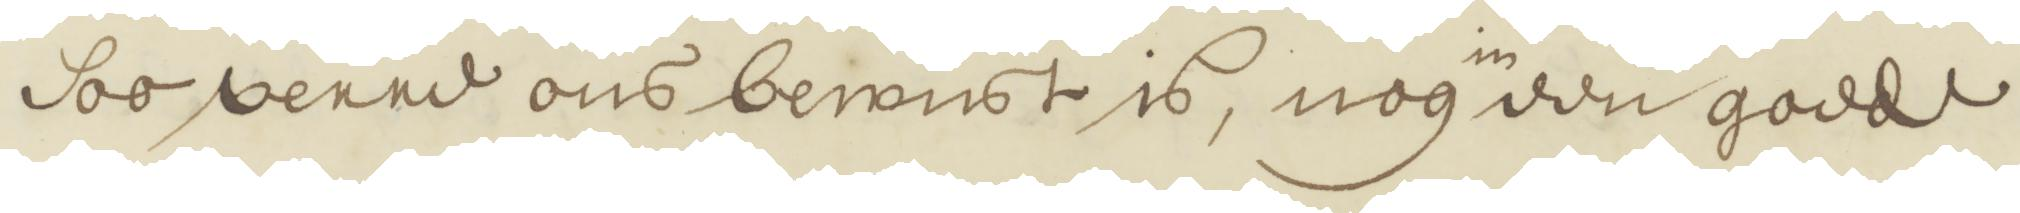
soo verre ons bewust is, nog een goede
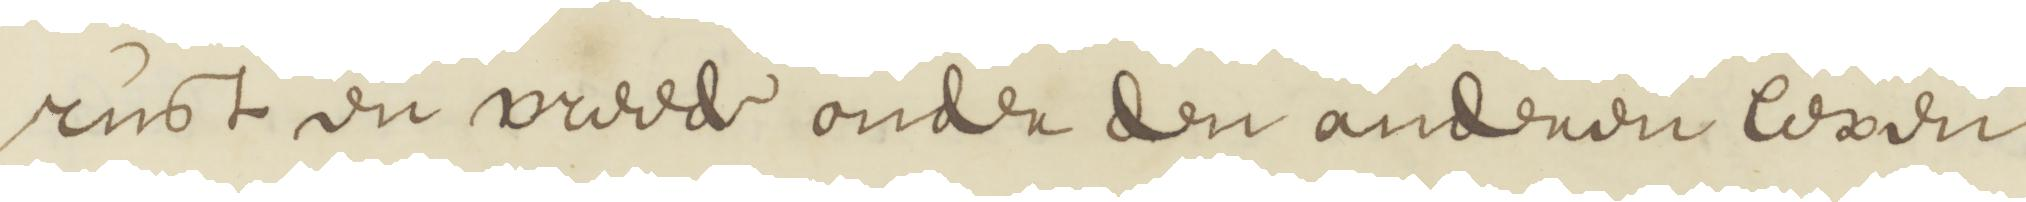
rust en vreede onder den anderen leven
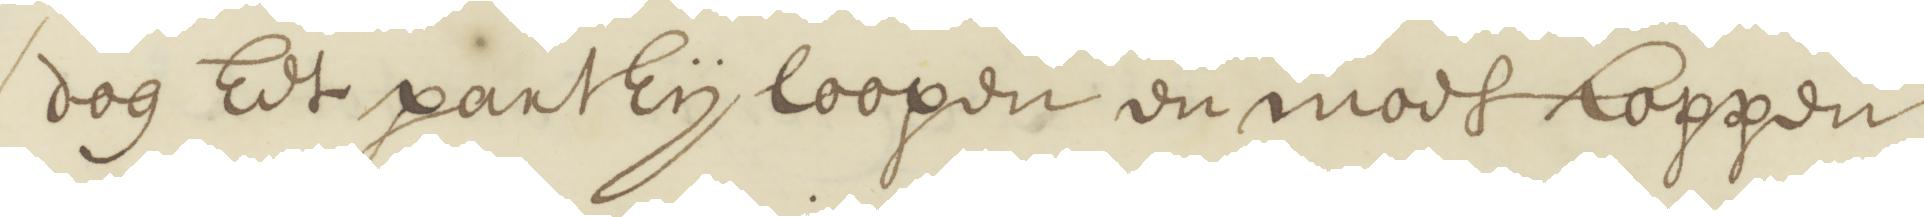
dog het parthij loopen en moeskoppen
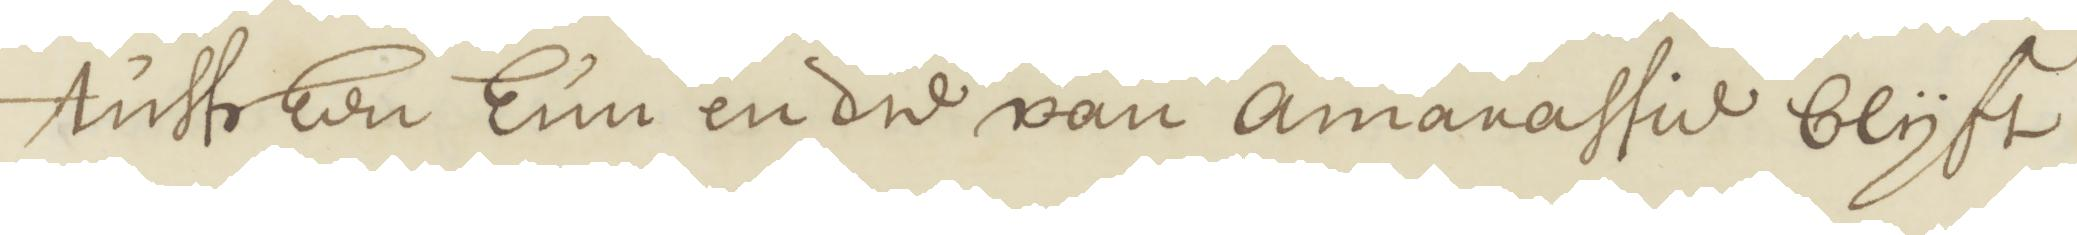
tusschen hun en die van amarassie blijft
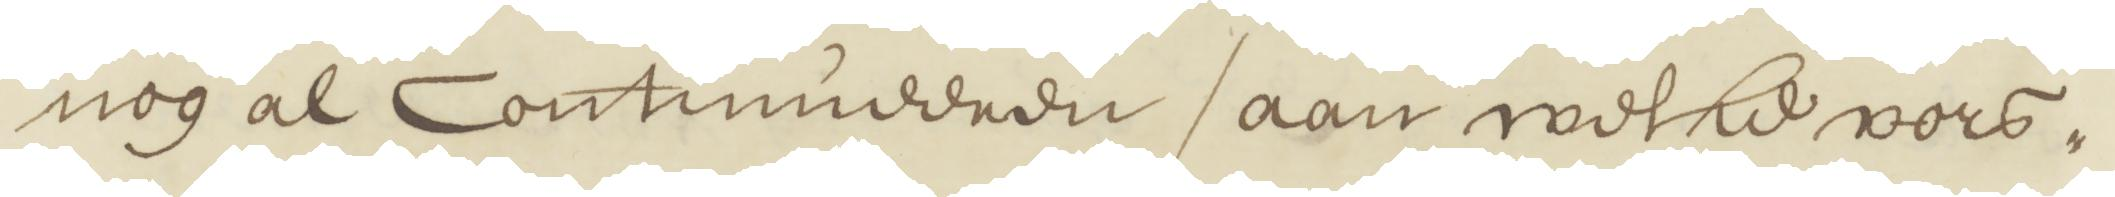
nog al continueeren /aan welke vors„
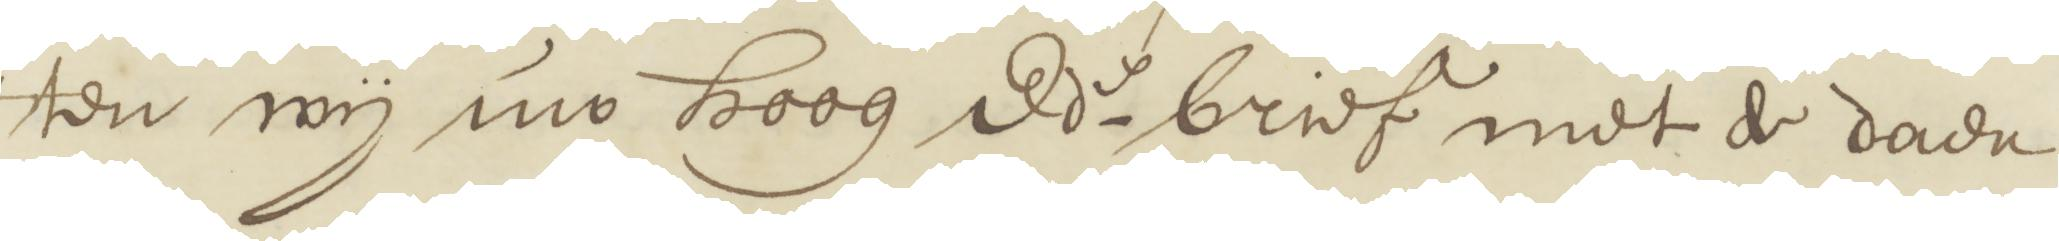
ten wij uw hoog Ed=s brief met de daer
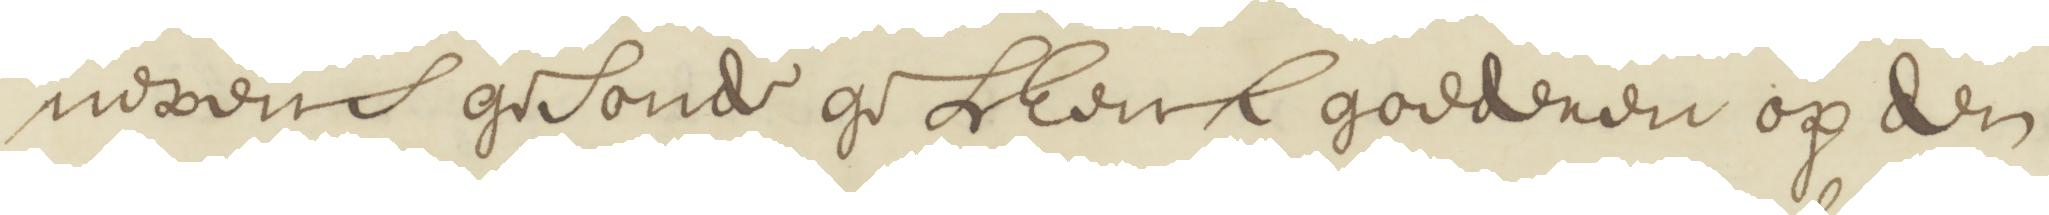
nevens gesonde geschenk goederen op den
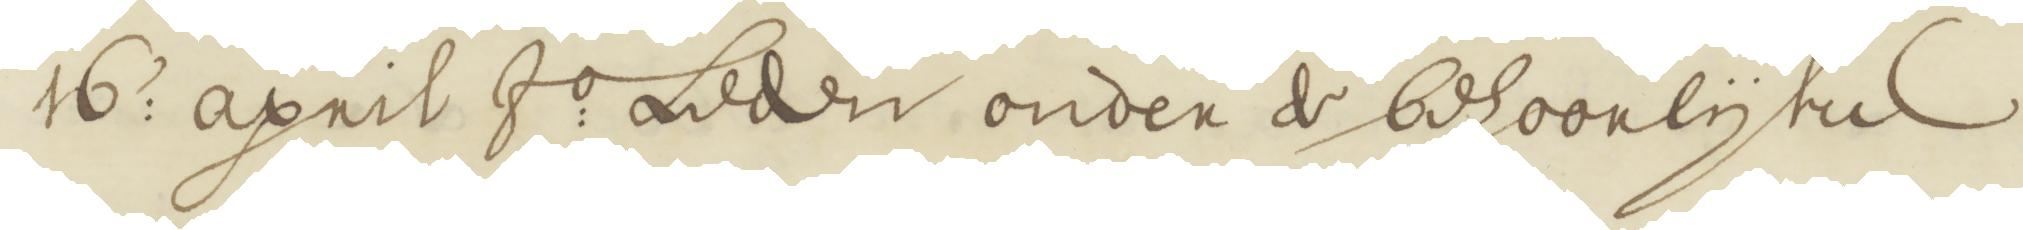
16:' april j:o leden onder de behoorlijke
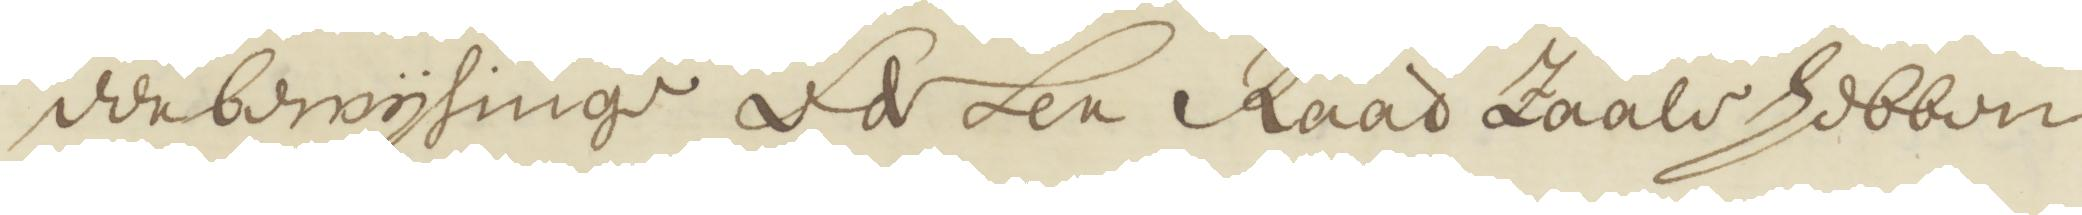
eerbewijsinge tedeser Raad zaale hebben
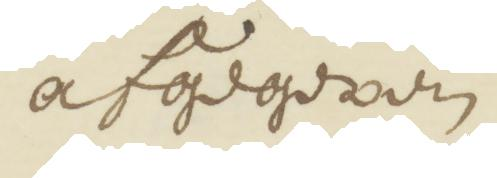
afgegeven
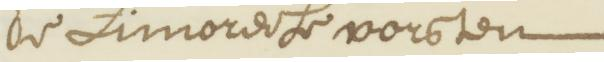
de timoreese vorsten
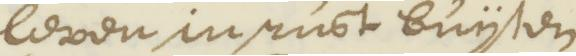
leven in rust buijten
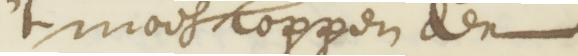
’t moeskoppen der
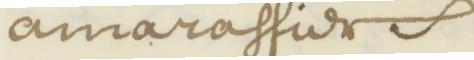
amarassiers
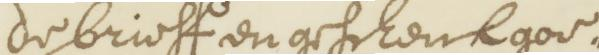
de brieff en geschenk goe„
